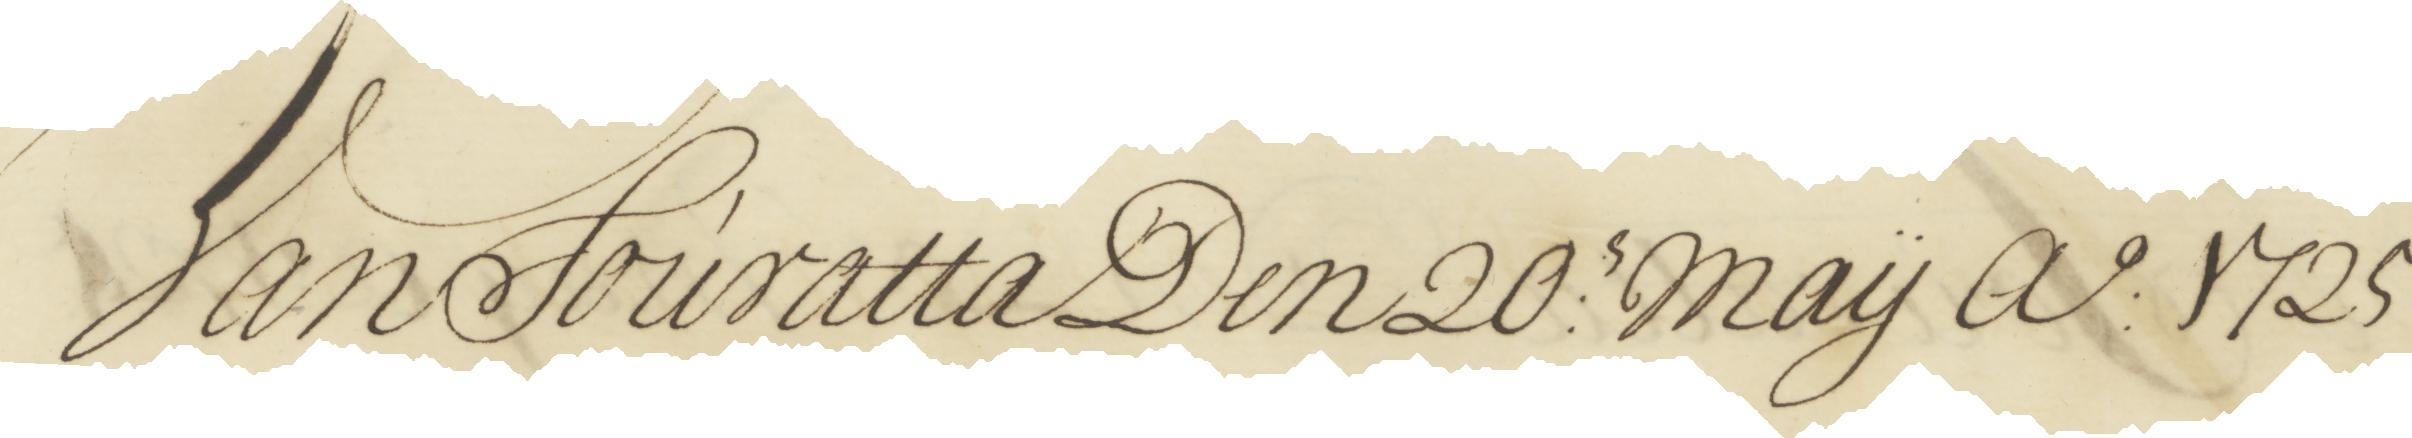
Van Souratta Den 20:en Maij A:o 1725
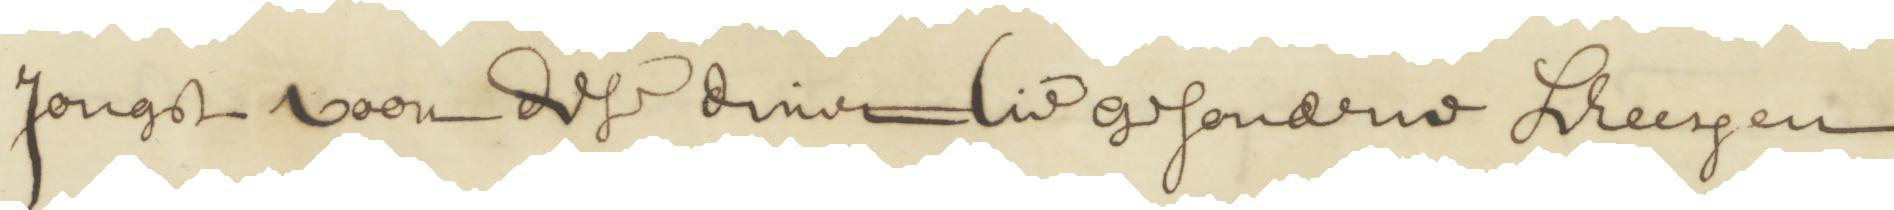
Jongst voor dese directie gesondene scheepen
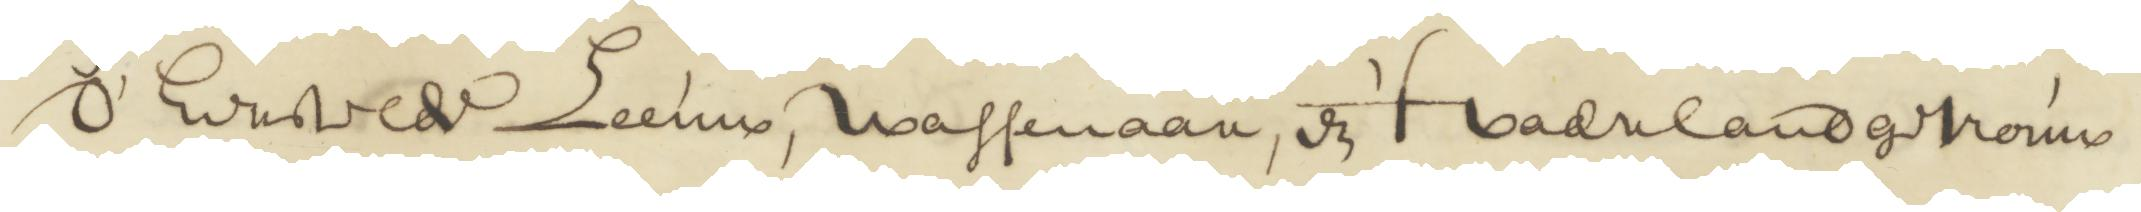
d’ herstelde Leeuw, Wassenaar, en ’T Vaderland getrouw
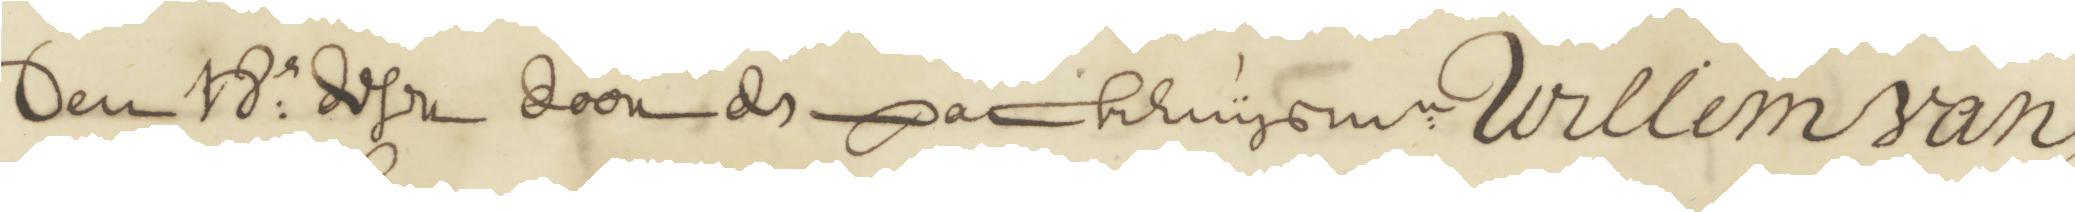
den 18:en deser door den packhuijsm:r Willem van
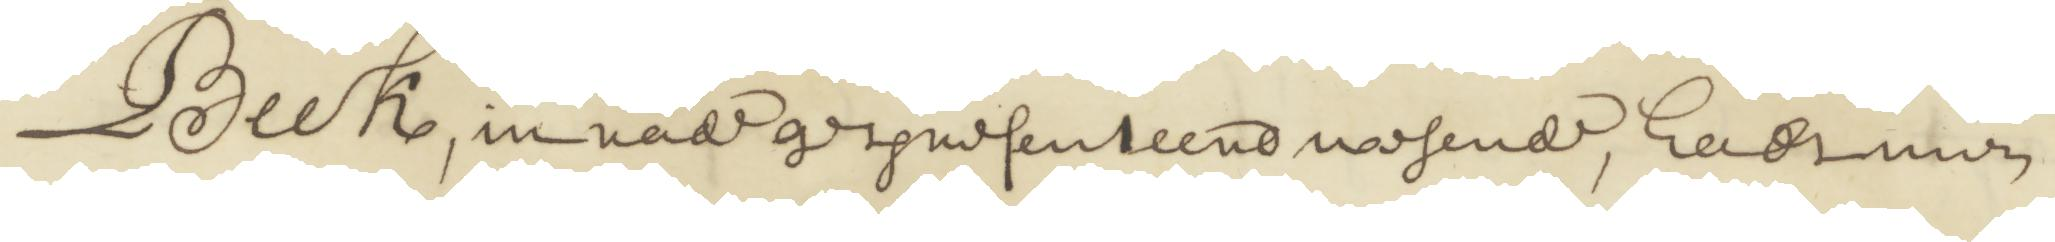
Beek, in rade gepresenteerd wesende, heeft men
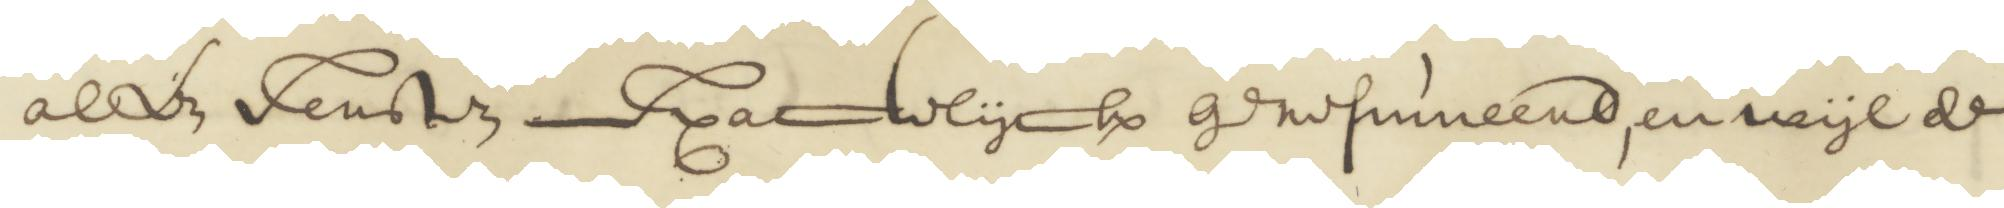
al ten Eersten Exactelijck geresumeerd, en wijl de
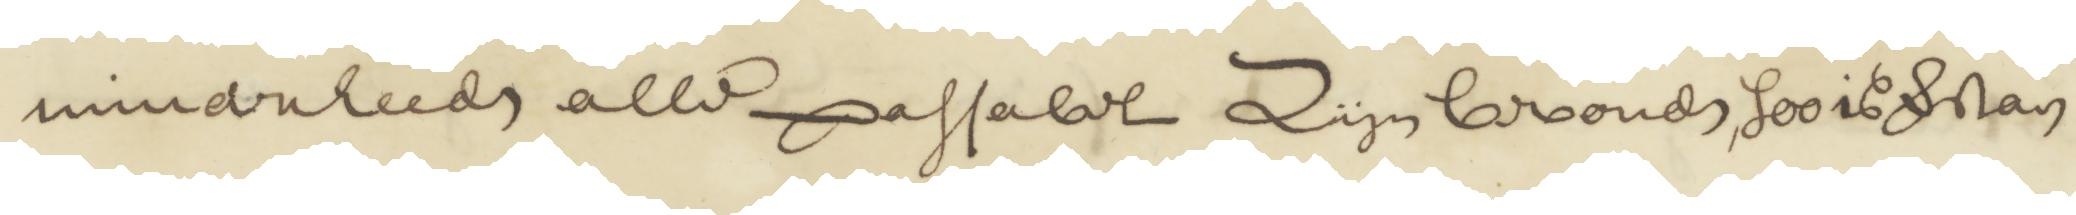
minderheeden alle passabel zijn bevonden, soo is verstaen
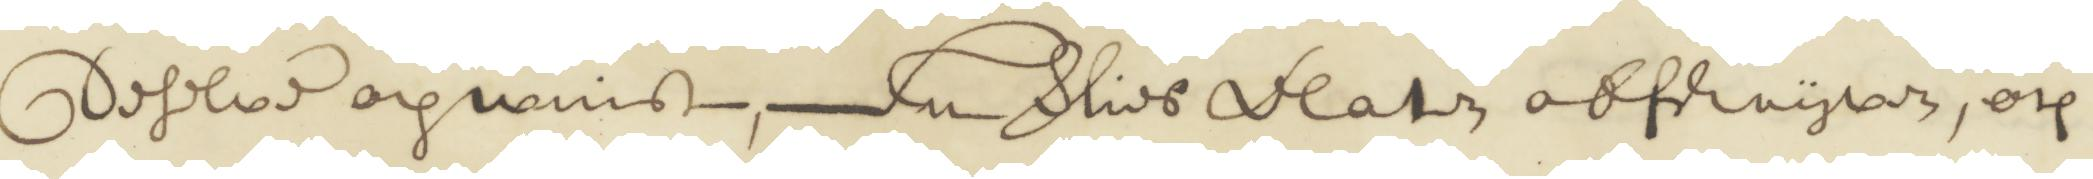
deselve opwinst, En verlies telaten afschrijven, op
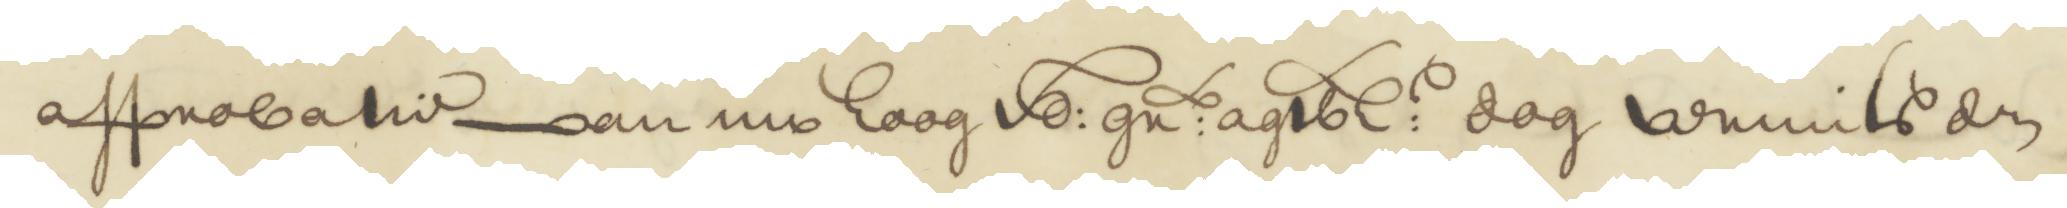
approbatie van uw hoog Ed: gr:te agtbh:' dog vermits den
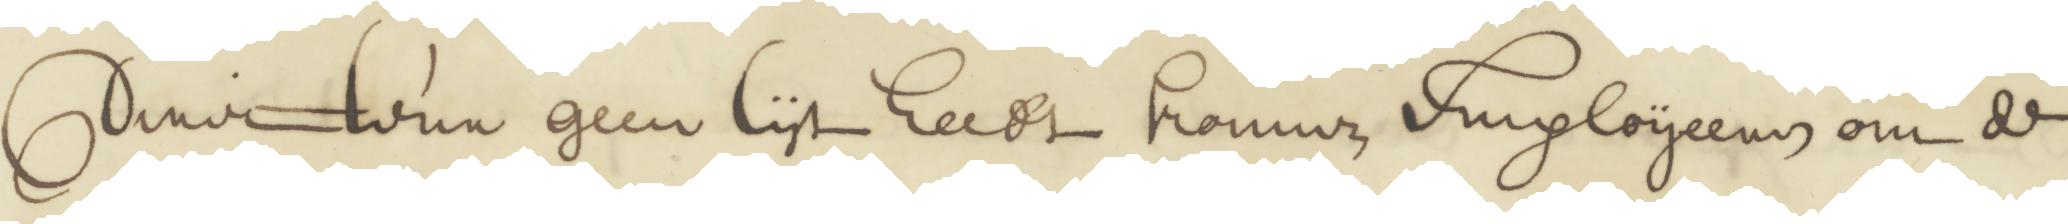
directeur geen tijt heeft konnen Emploijeeren om de
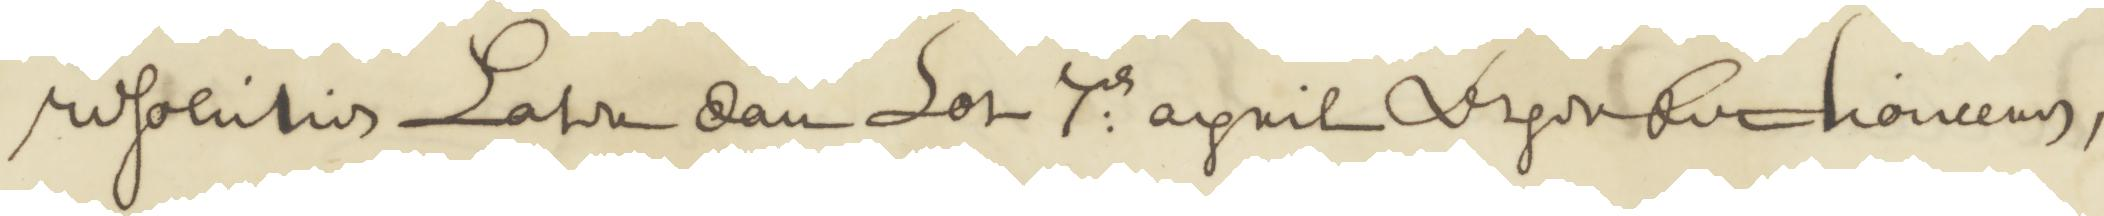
resolutien Later dan tot 7:en april teperfectioneeren,
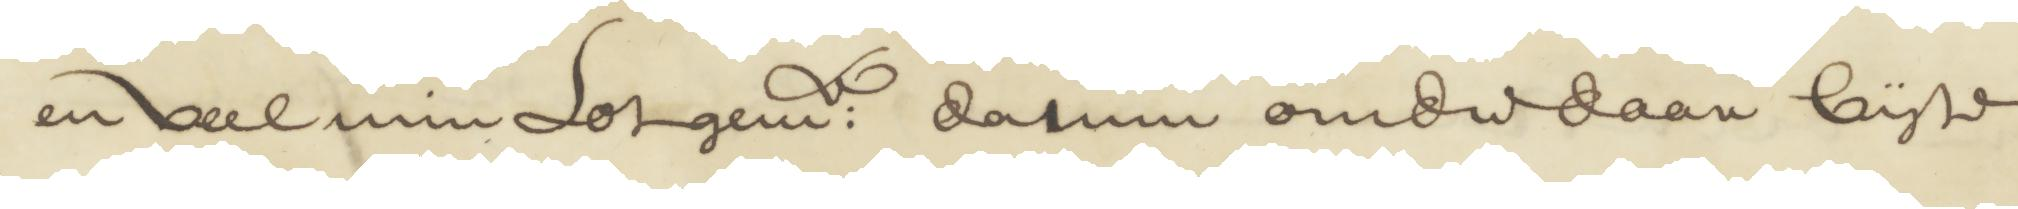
en Veel min tot gem:te datum omdiedaar bijte
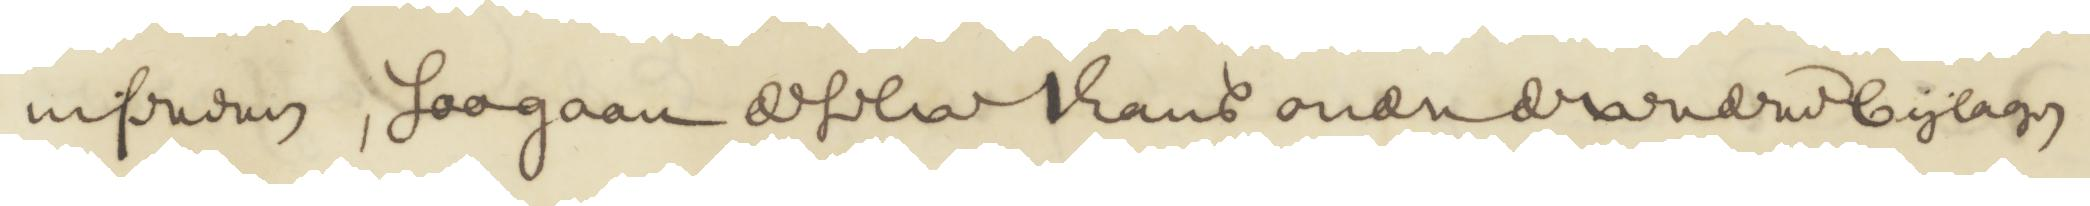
insereren, soogaan deselve thans onder de verdere bijlagen
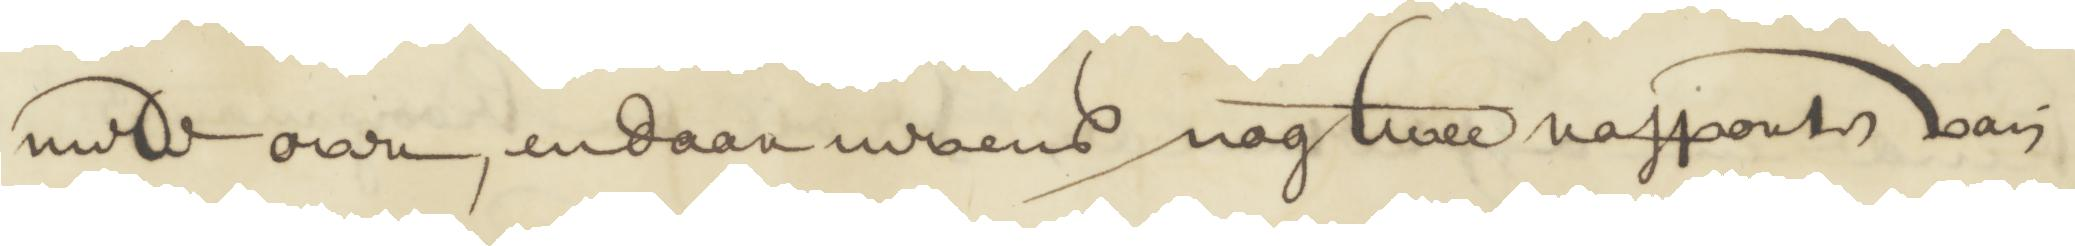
mede over, endaar nevens nog twee rapporten Van
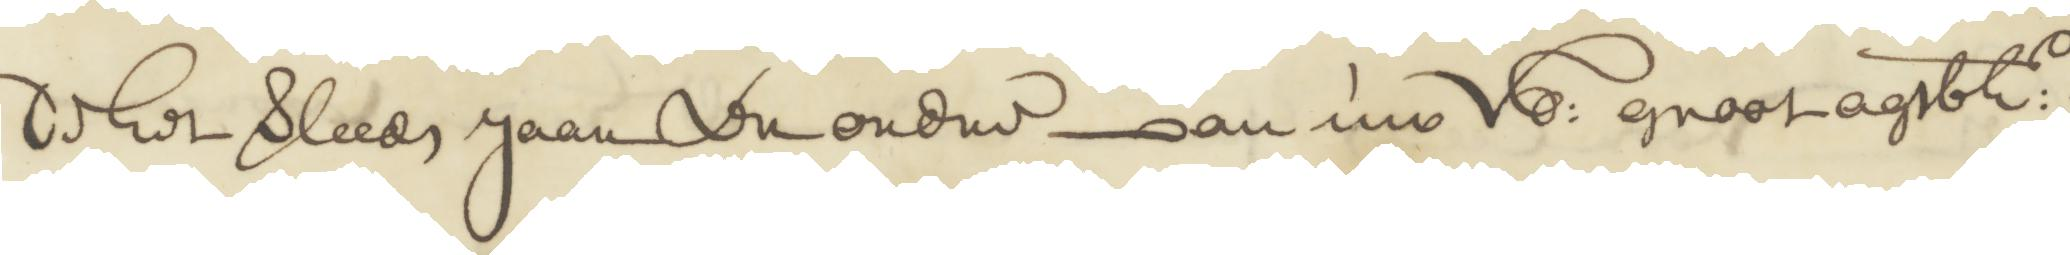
de het verleeden Jaar ter ordre van uw Ed: groot agtbh:'
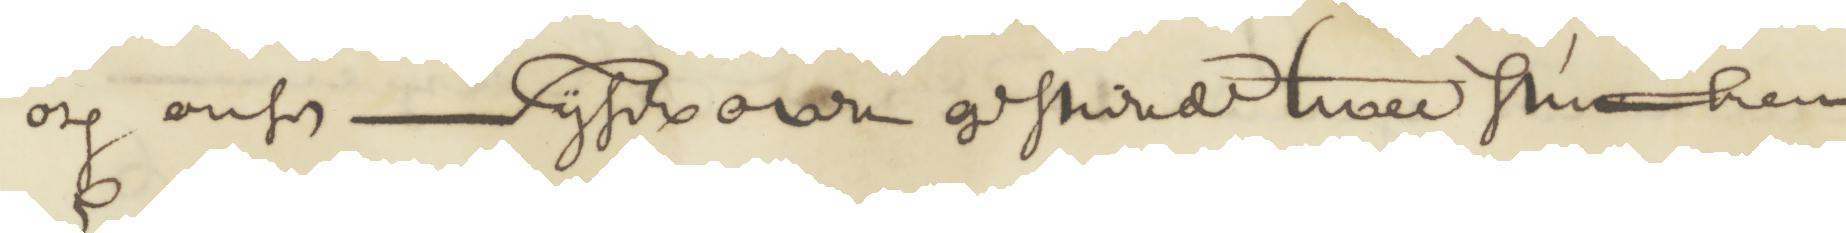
op onsen Eijsch over gestierde twee stucken
